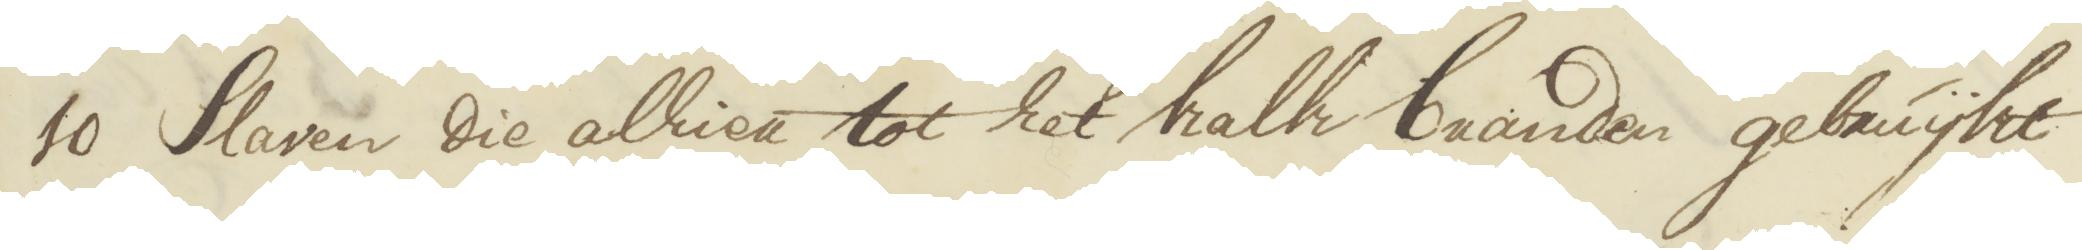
10 slaven die alhier tot het kalkbranden gebruijkt
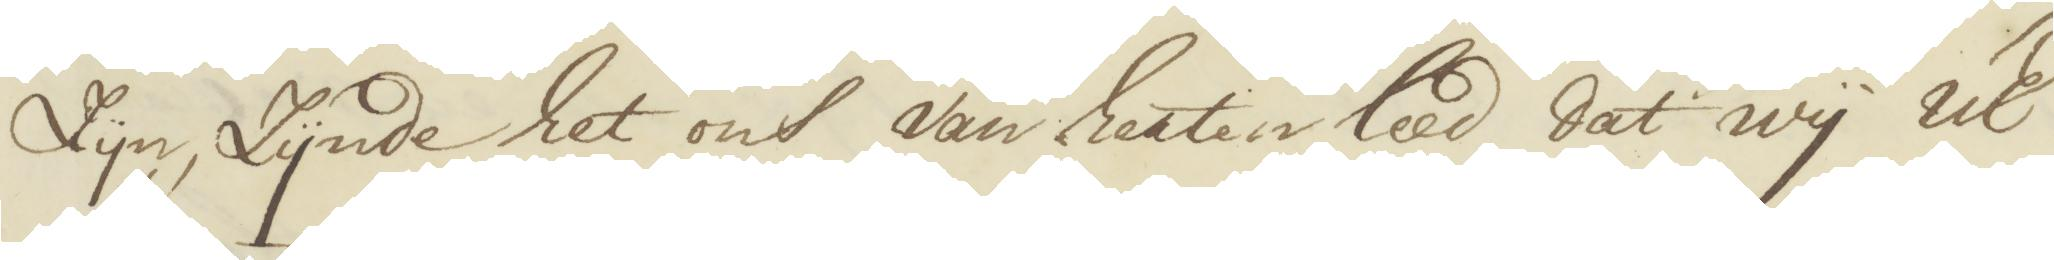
zijn, zijnde het ons van herten leed dat wij UE:
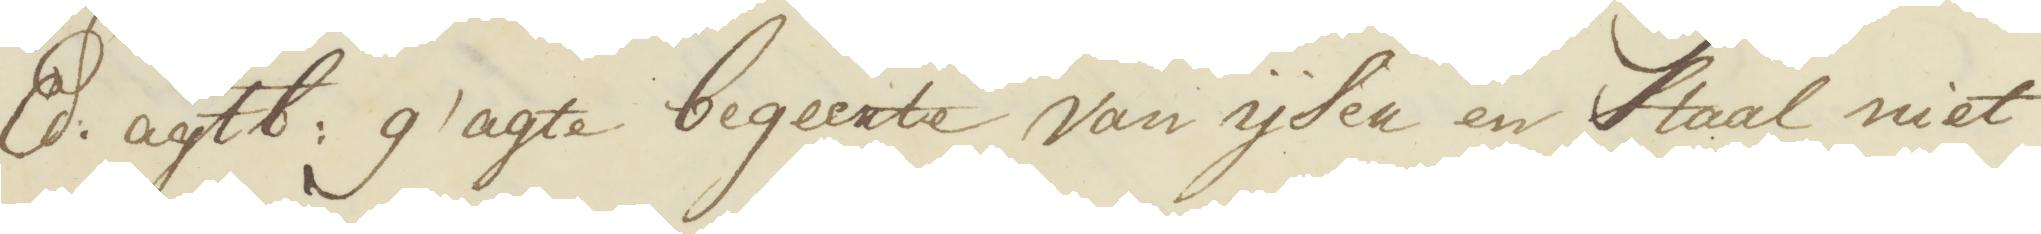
Ed: Agtb: g’agte begeerte van ijser en staal niet
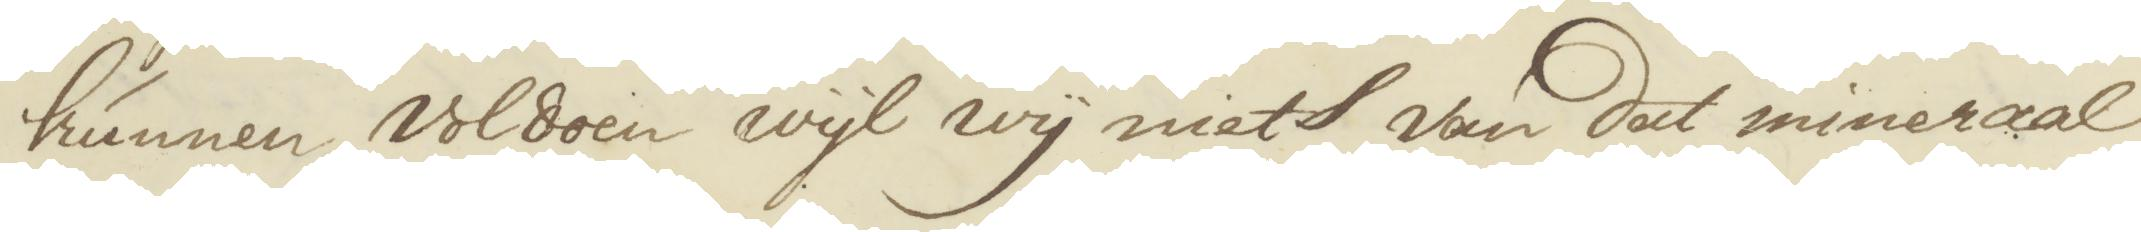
kunnen voldoen wijl wij niets van dat mineraal
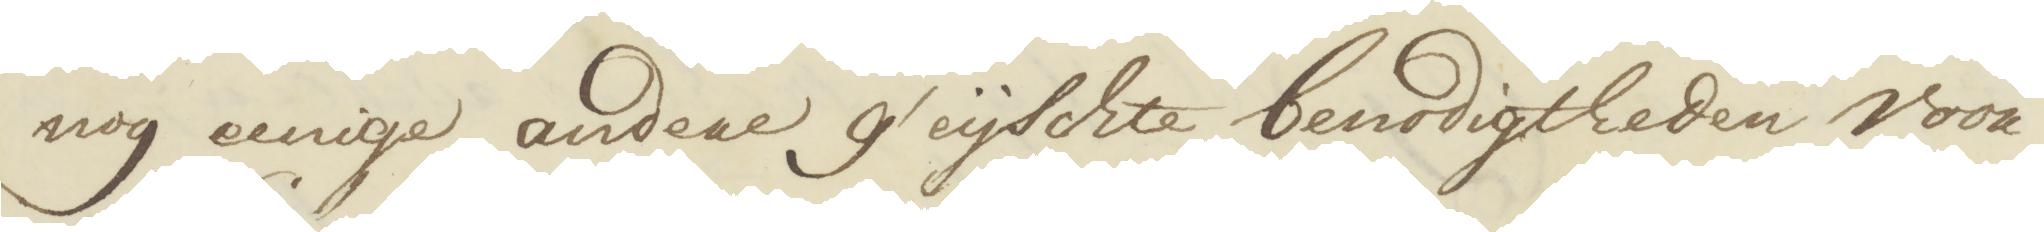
nog eenige andere g’eijschte benodigtheden voor
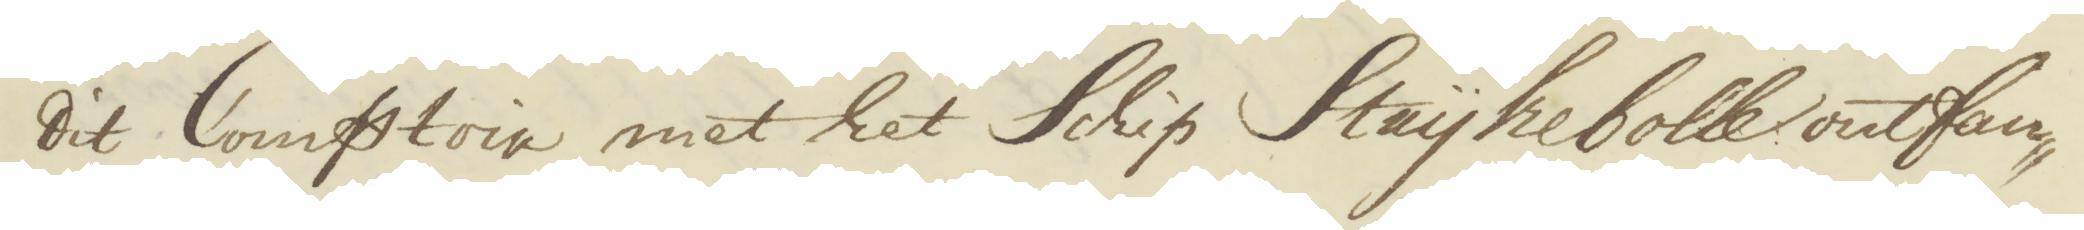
dit Comptoir met het schip Strijkebolle ontfan„
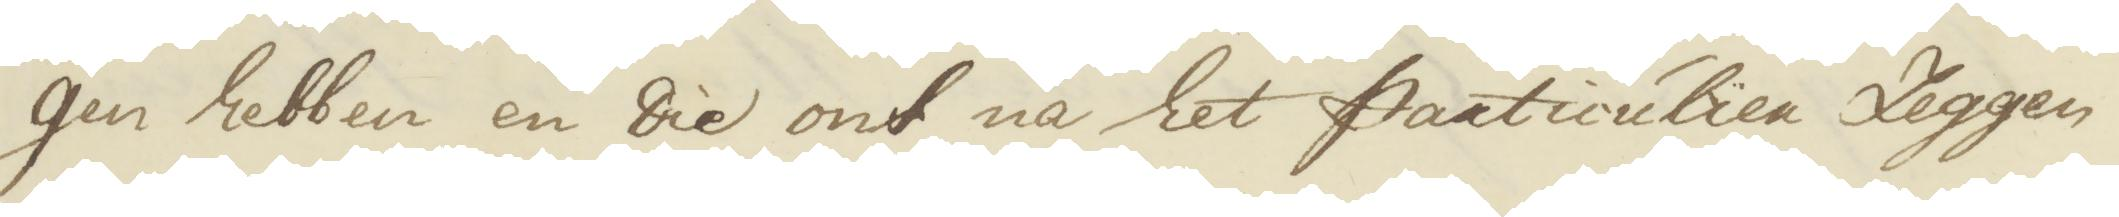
gen hebben en die ons na het particulier zeggen
